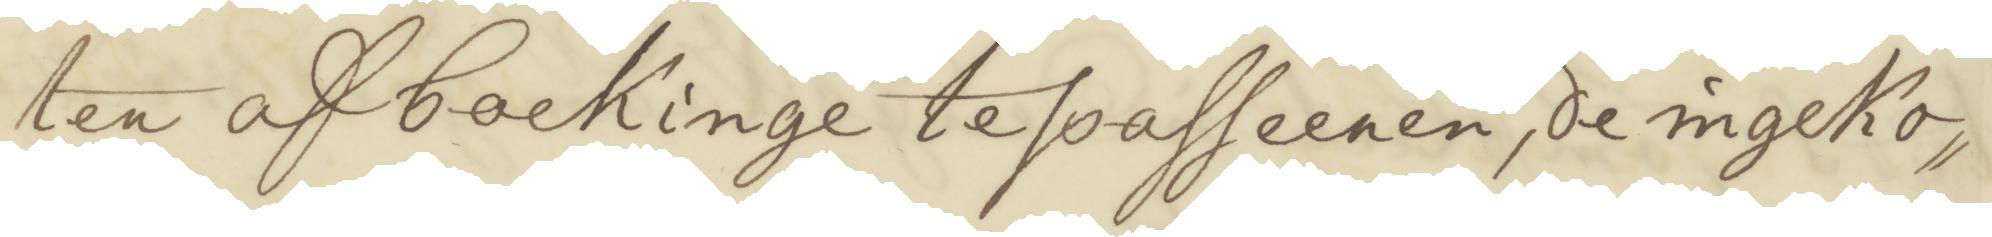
ter afboekinge te passeeren, de ingeko„
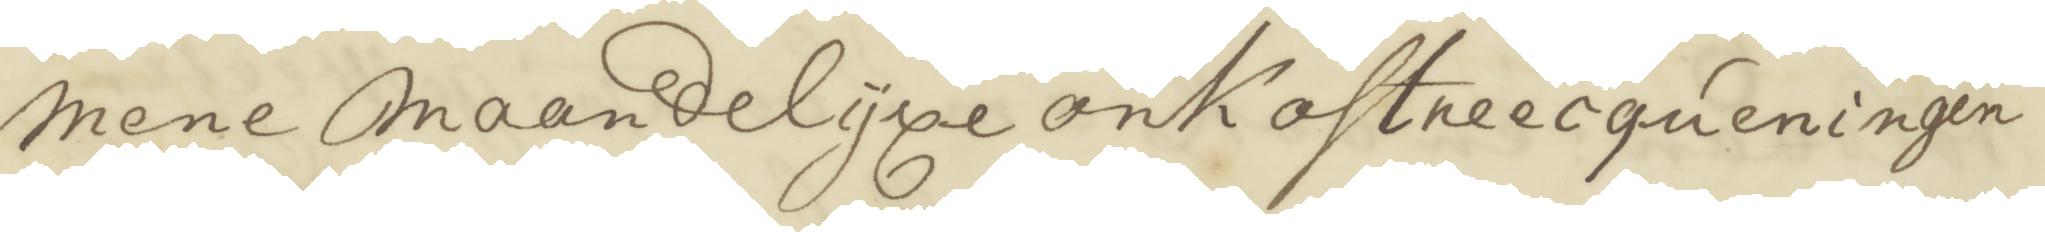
mene maandelijxe onkostreecqueningen
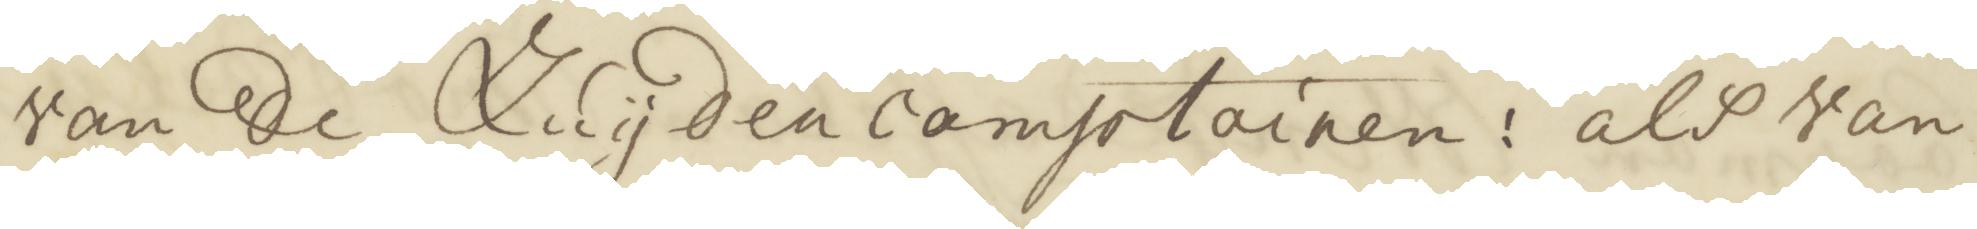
van de zuijder comptoiren: als van
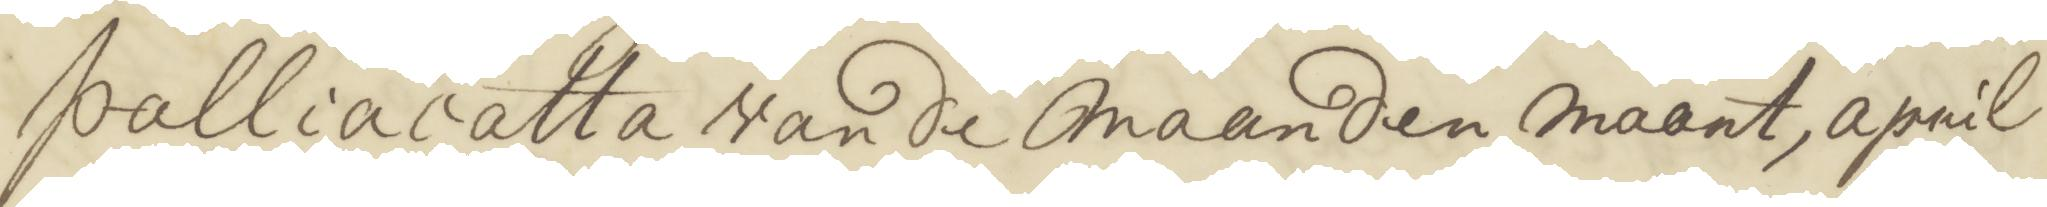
palliacatta van de maanden maart, april
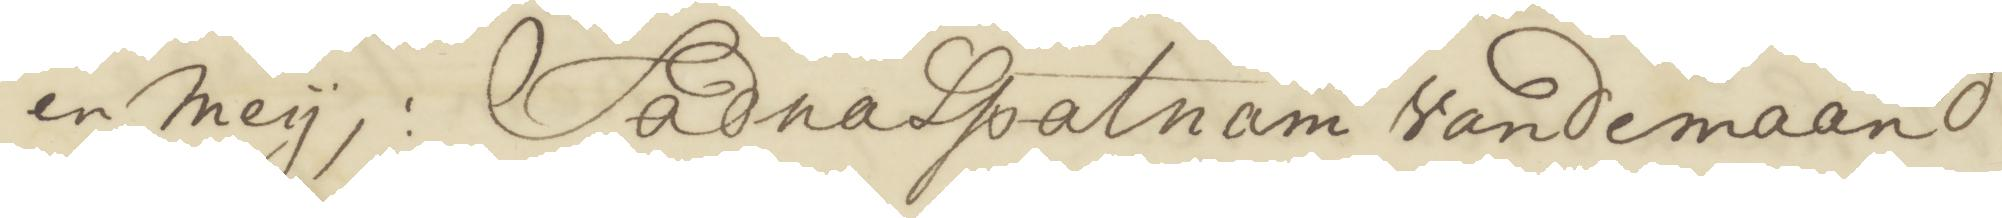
en meij, : sadraspatnam van de maand
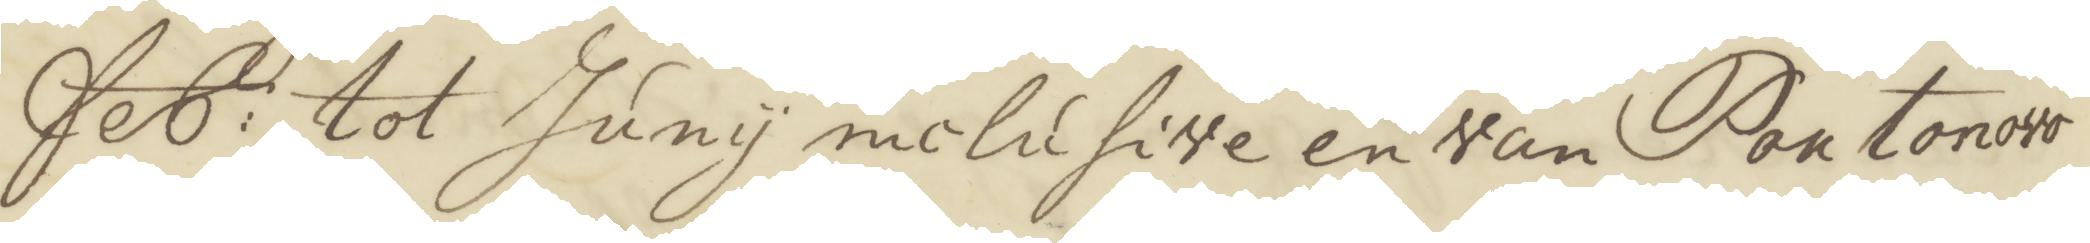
feb: tot Junij inclusive en van Portonovo
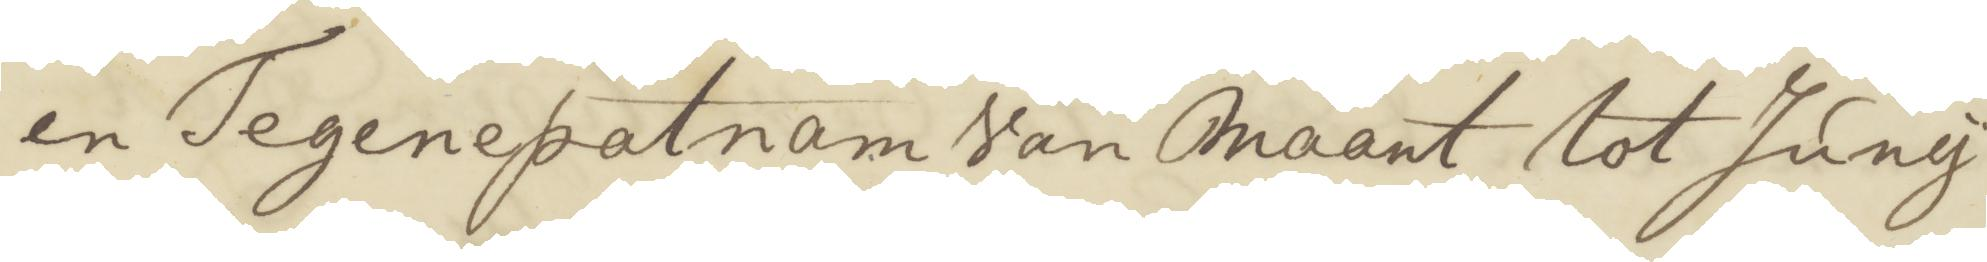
en Tegenepatnam van maart tot Junij
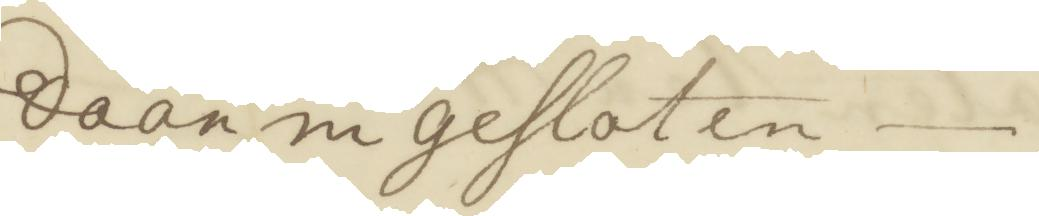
daar in gesloten —
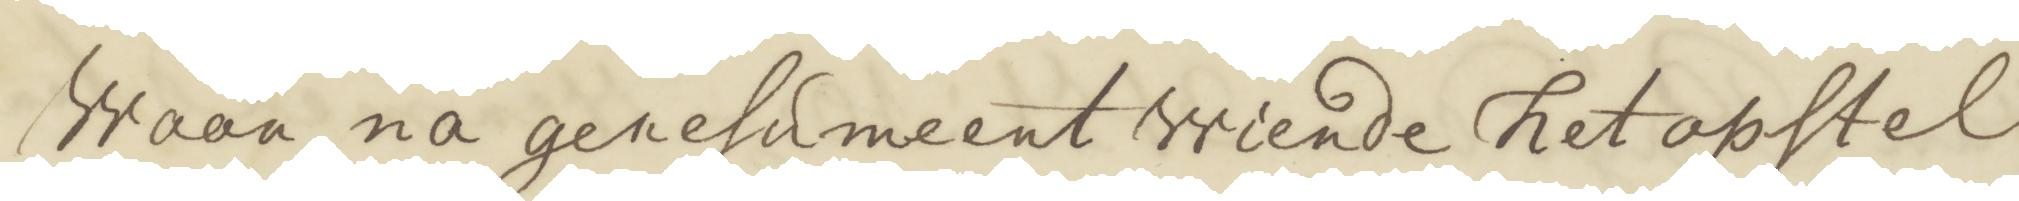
Waar na geresumeert wierde het opstel
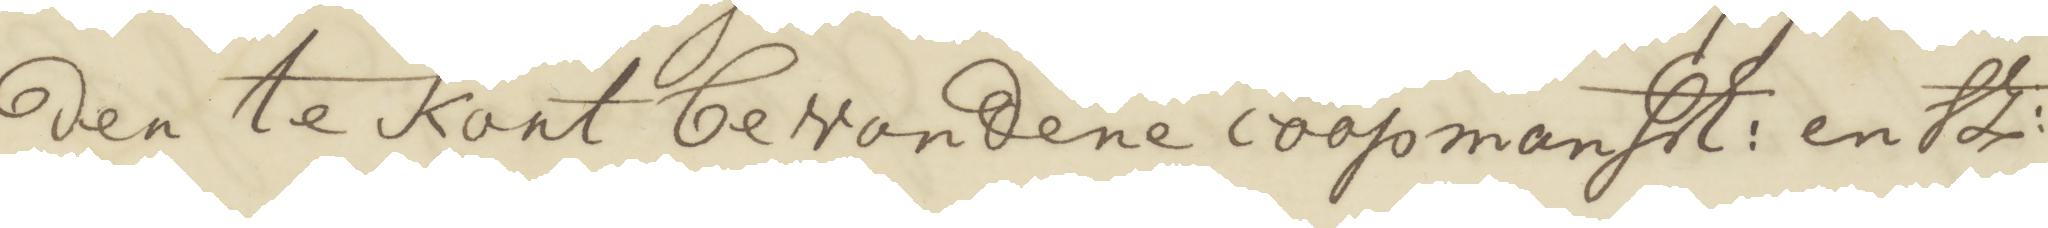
der te kort bevondene coopmansch: ensz
